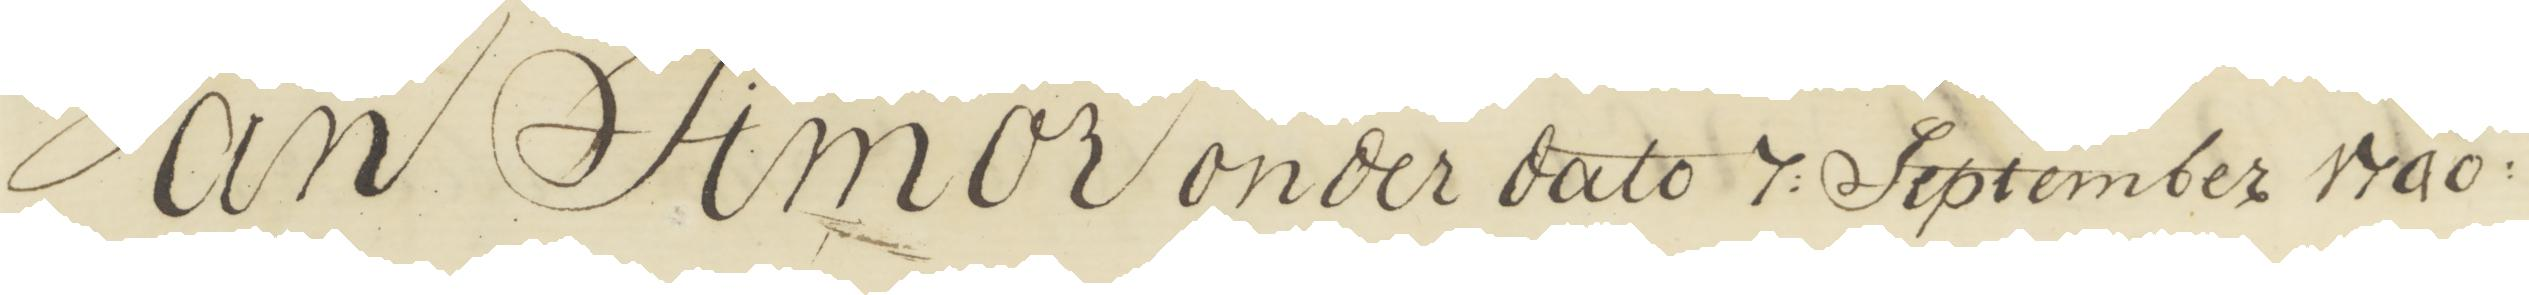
Van Timor onder dato 7: September 1740:
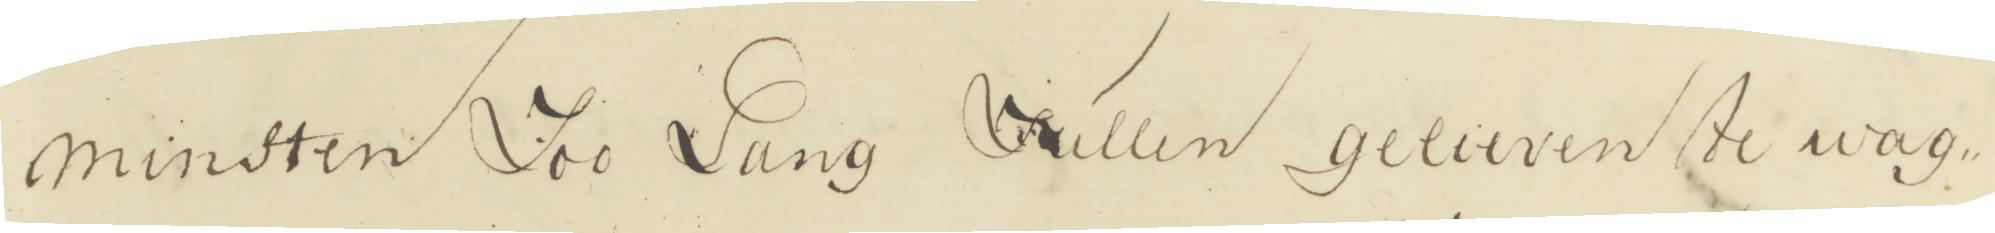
minsten zoo Lang zullen gelieven te wag„
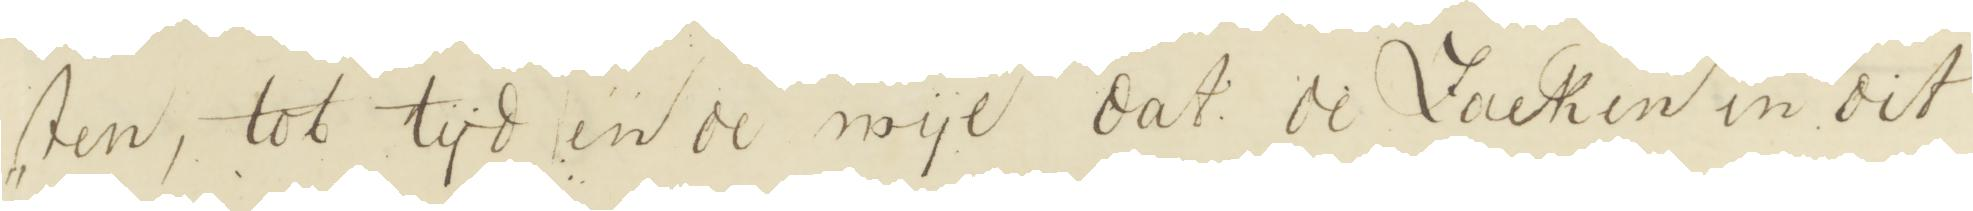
„ten, tot tijd en de wijl dat de zaeken in dit
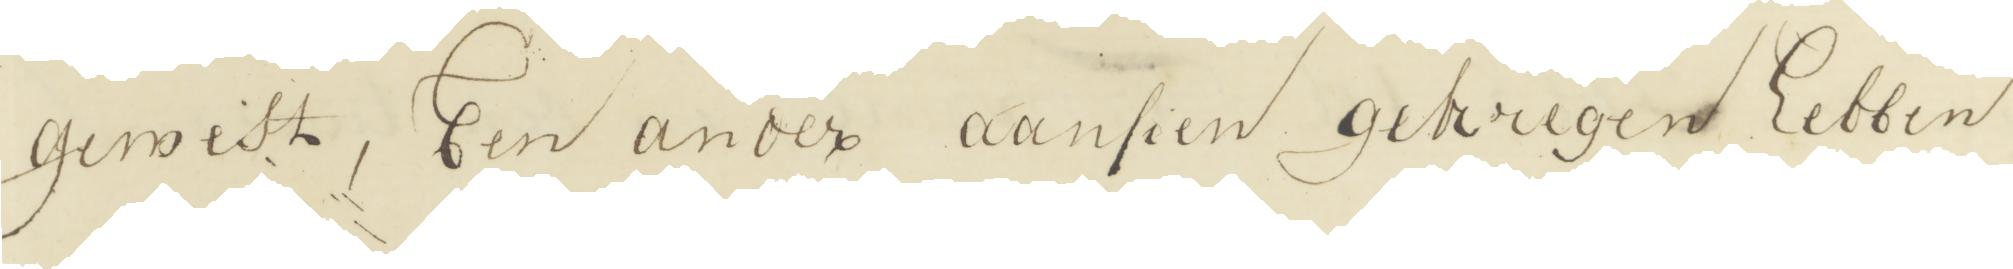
gewest, Een ander aansien gekregen hebben
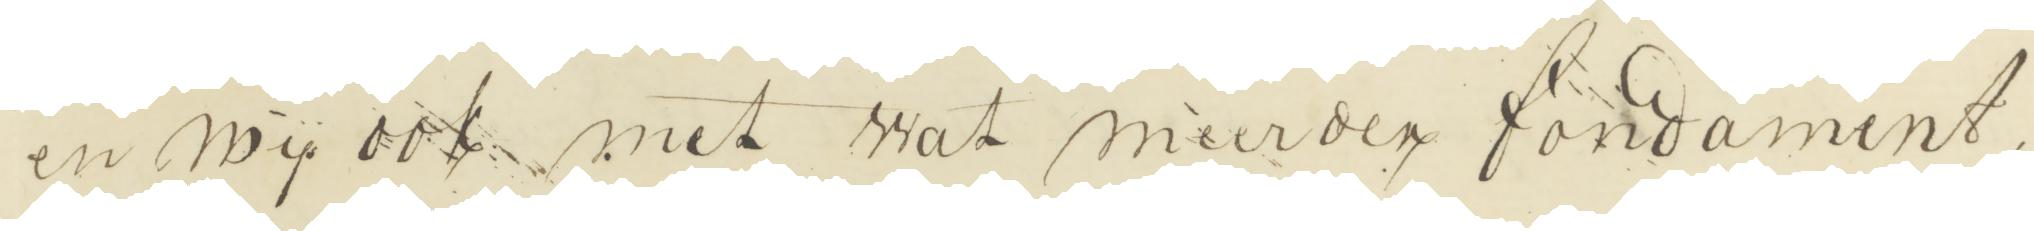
en wij ook met wat meerder fondament,
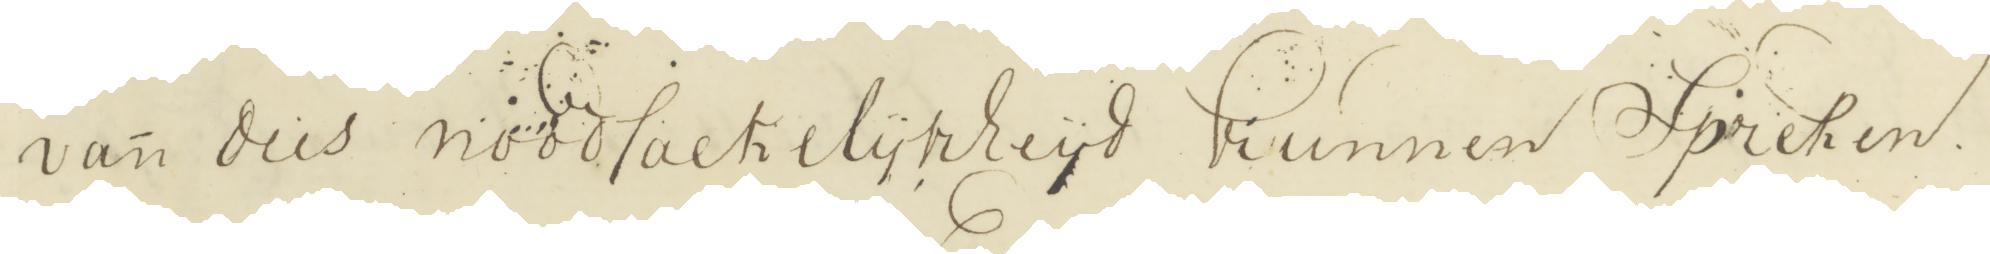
van dies noodsaekelijkheijd kunnen spreken.
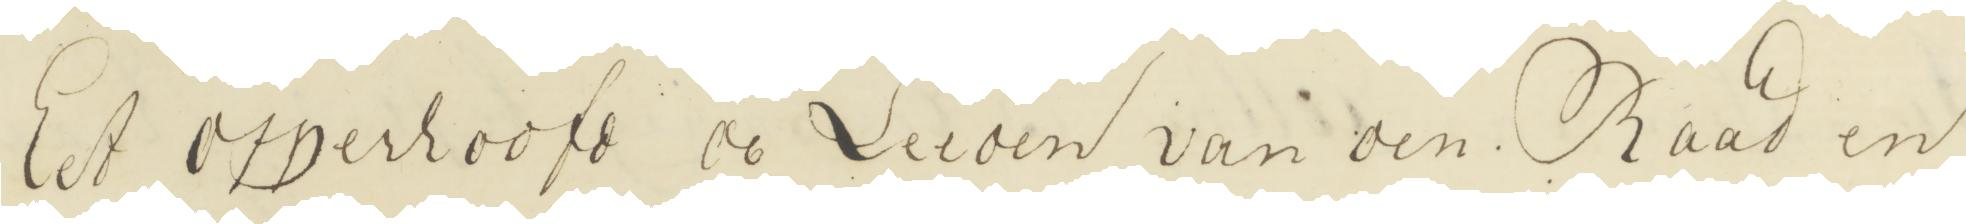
Het opperhoofd de Leeden van den Raad en
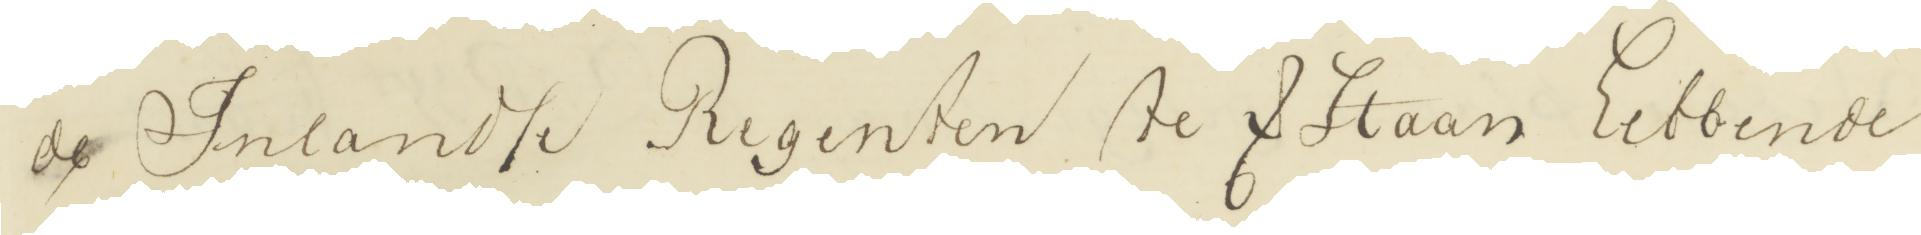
de Jnlandse Regenten te verstaan hebbende
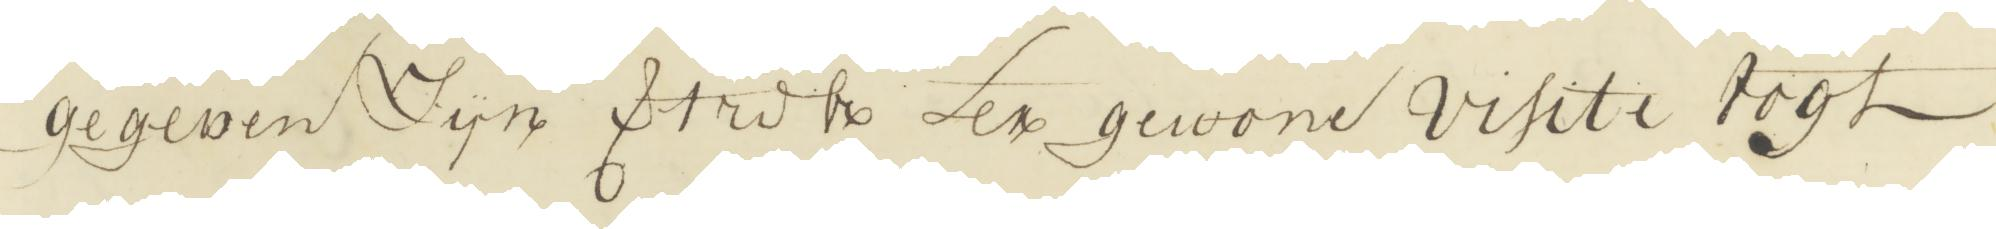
gegeven zijn vertrek ter gewone visite togt
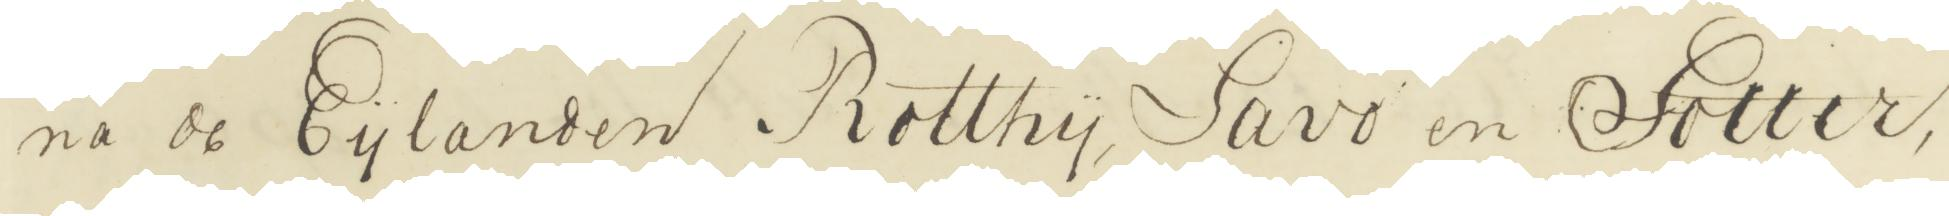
na de Eijlanden Rotthij, Savo en Sotter,
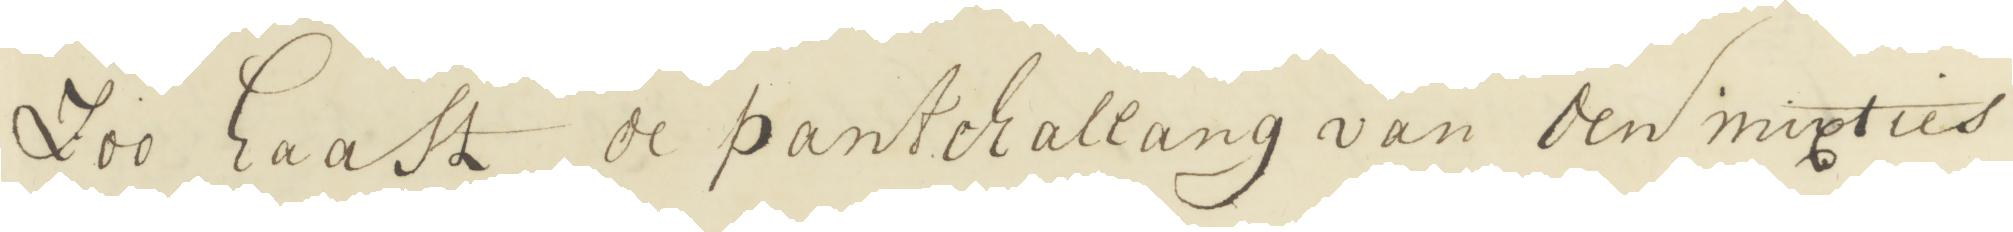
zoo haast de pantchallang van den mixties
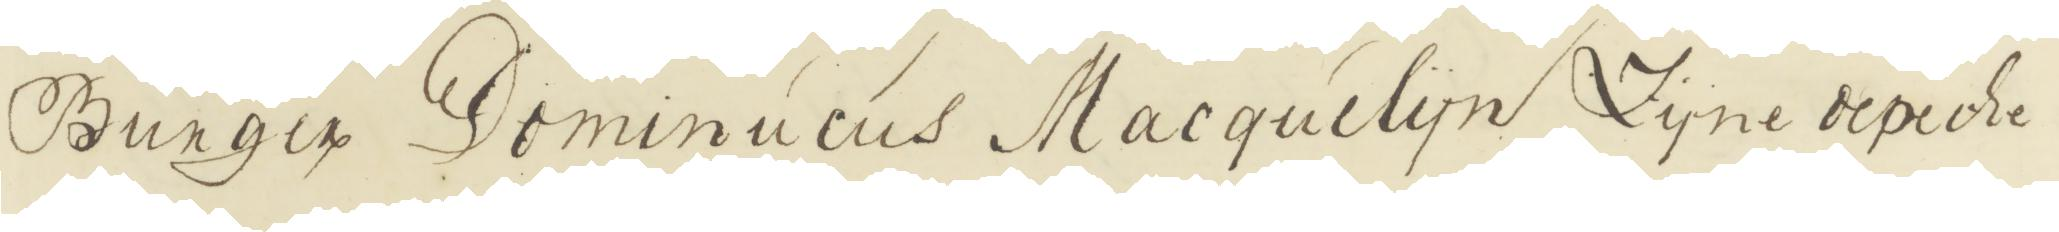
Burger Dominucus Macquelijn zijne depeche
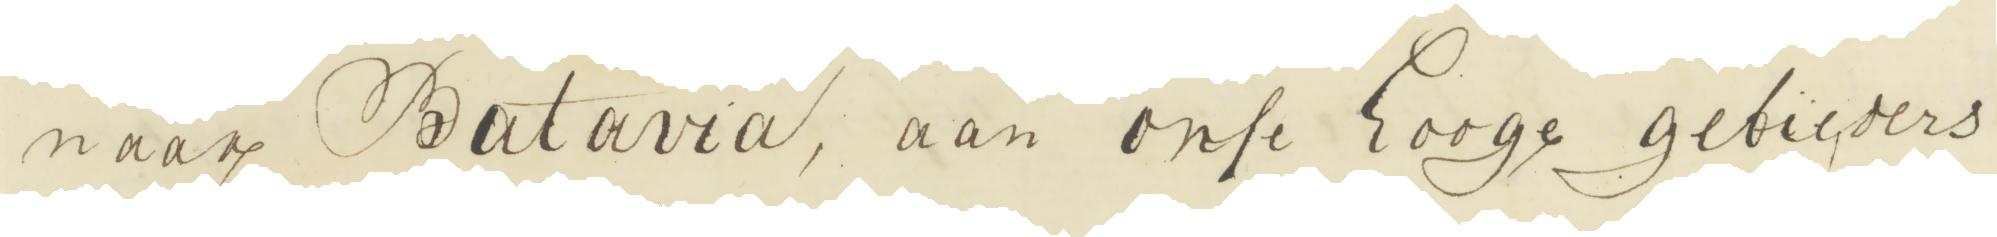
naar Batavia, aan onse hooge gebieders
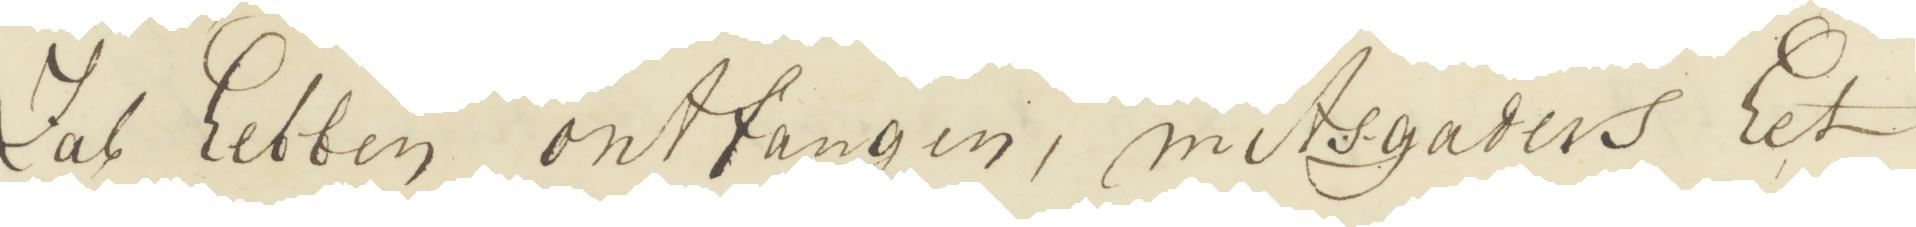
zal hebben ontfangen, mitsgaders het
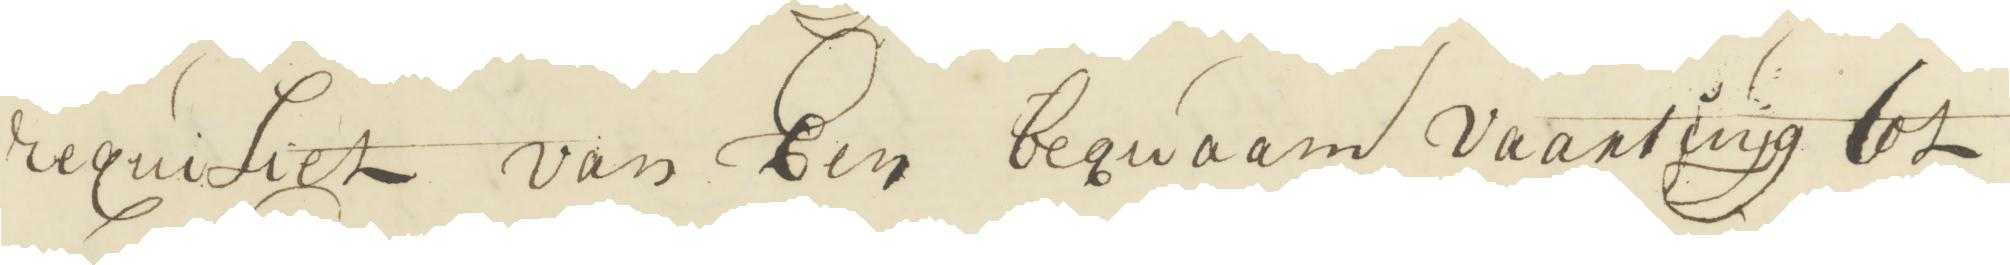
requisiet van Een bequaam vaartuijg tot
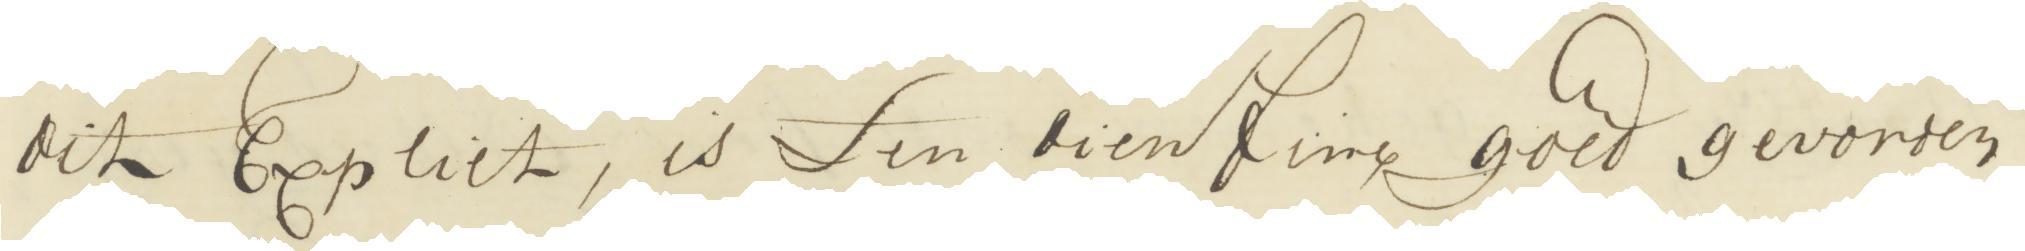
dit Expliet, is ten dien fine goed gevonden
